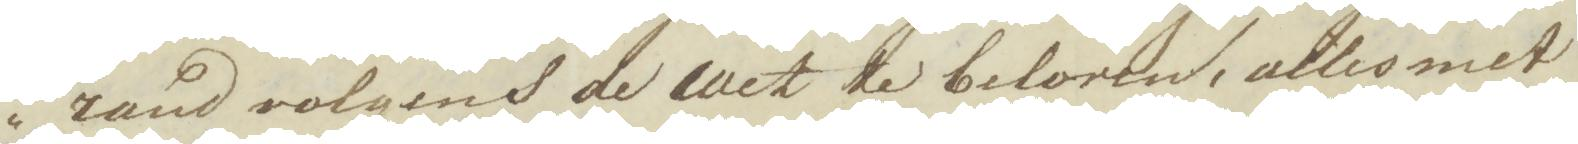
„rand volgens de wet te beloven, alles met
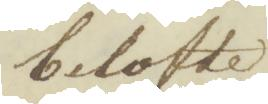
belofte
